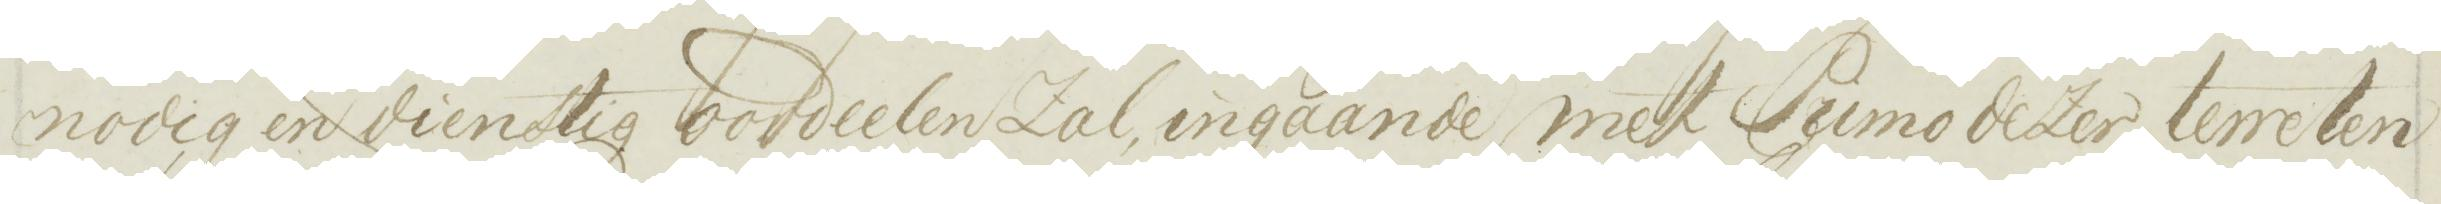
nodig en dienstig oordeelen zal, ingaande met Primo dezer, teweten
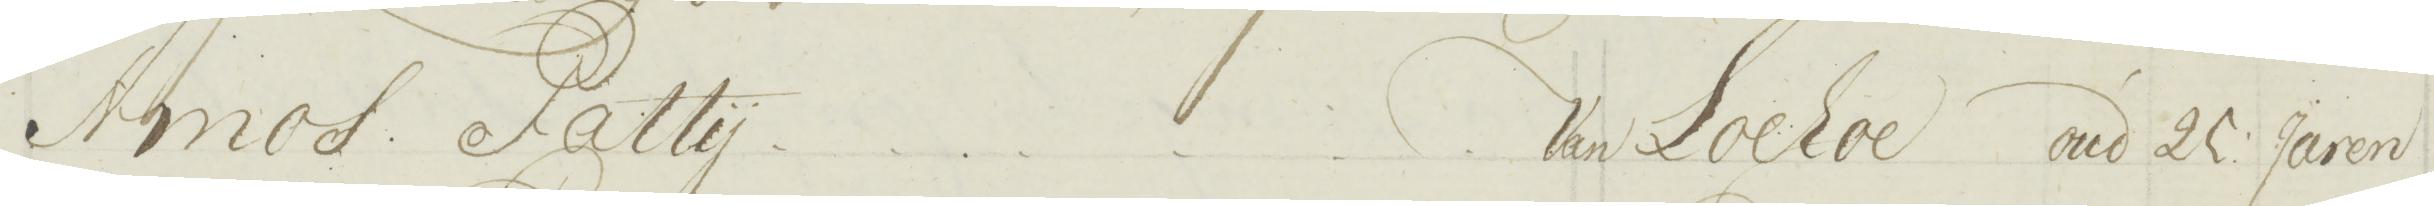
Amos Pattij - - - - - - - - van Loehoe oud 25: jaren
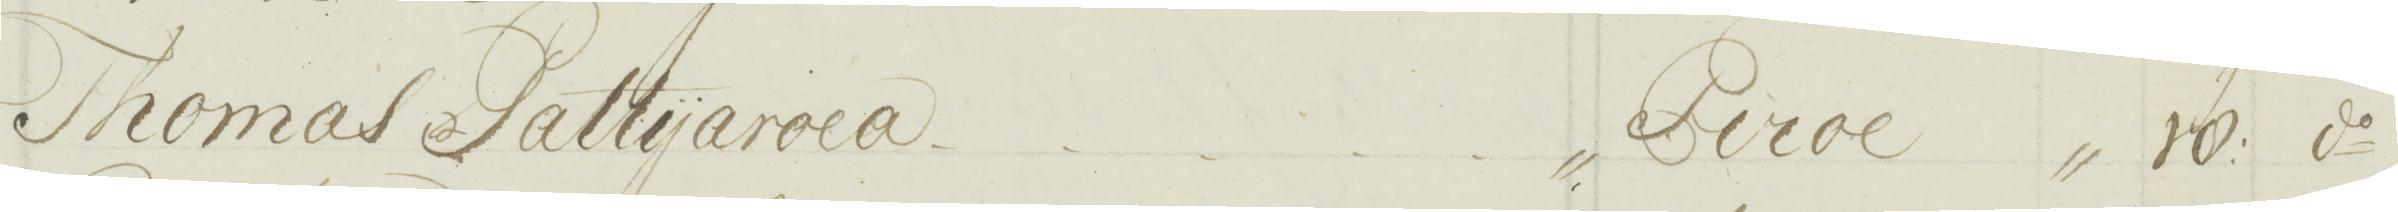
Thomas Pattijaroea - - - - - „ Piroe „ 18: d=o
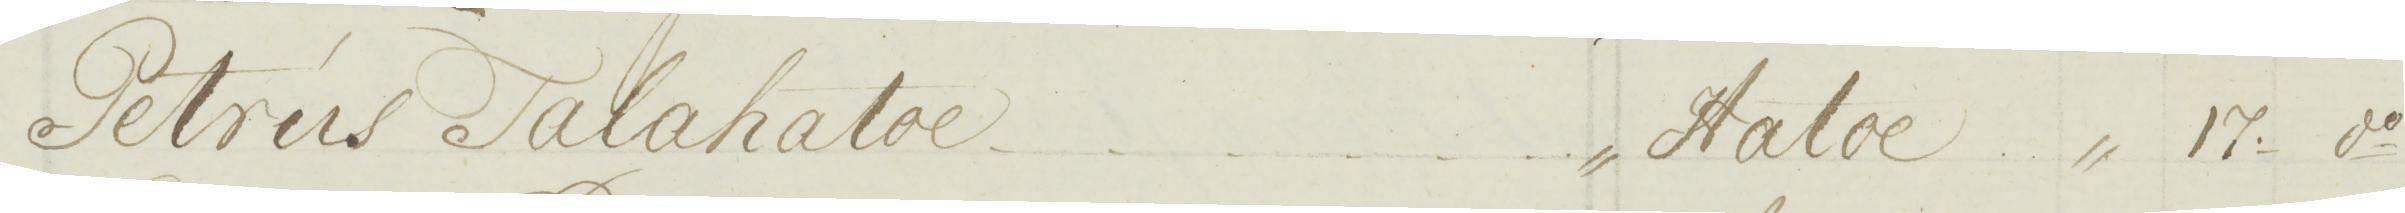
Petrus Talahatoe - - - - - - „ Hatoe „ 17: d=o
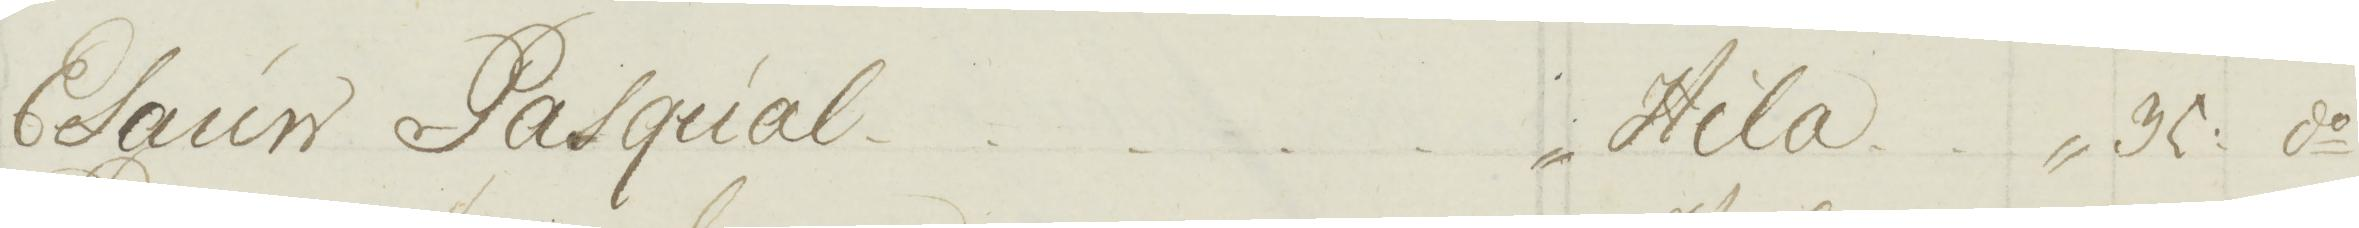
Esauw Pasqual - - - - - „ Hila „ 35: d=o
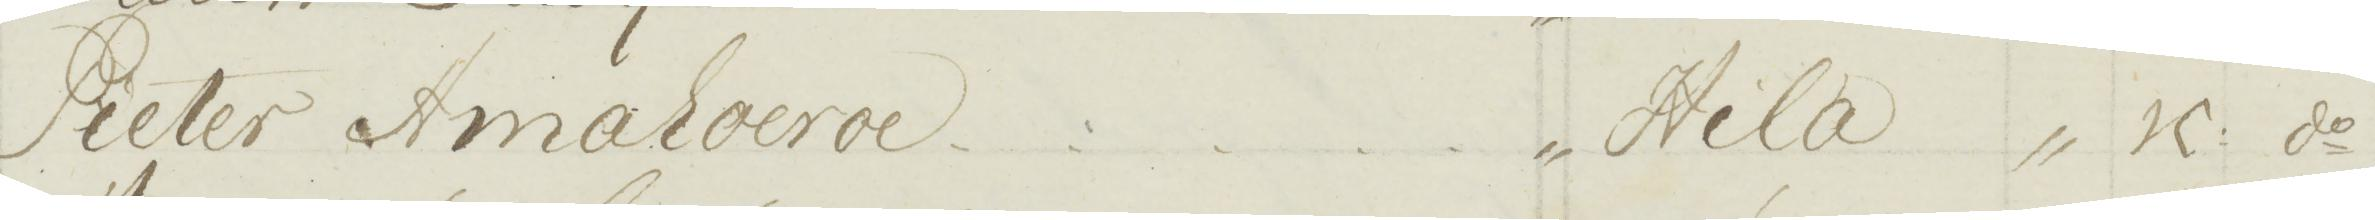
Pieter Amahoeroe - - - - - „ Hila „ 15: d=o
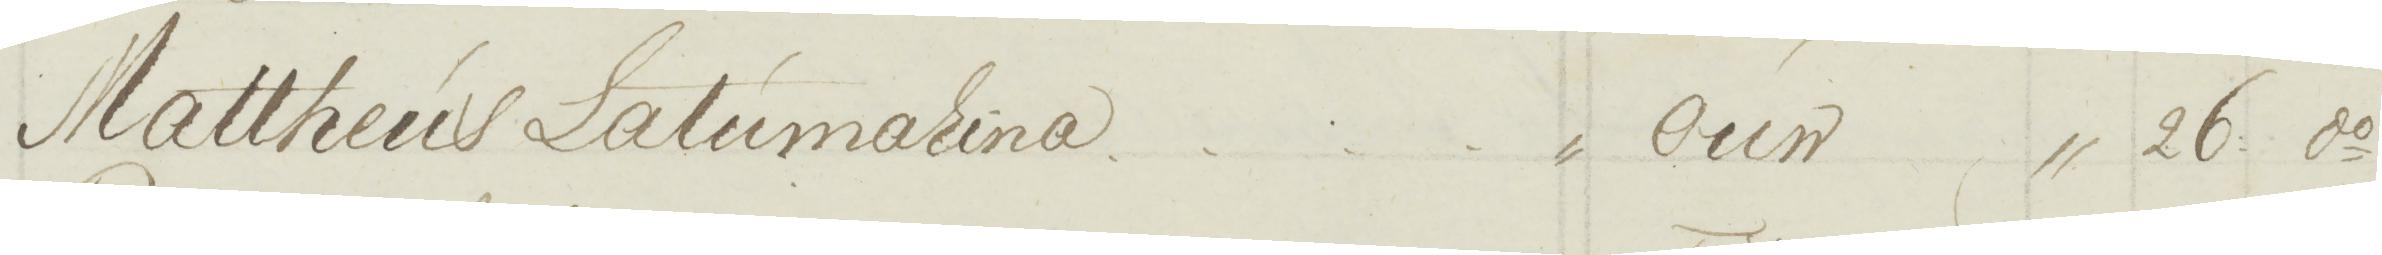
Mattheus Latumahina - - - „ Ouw 26: d=o
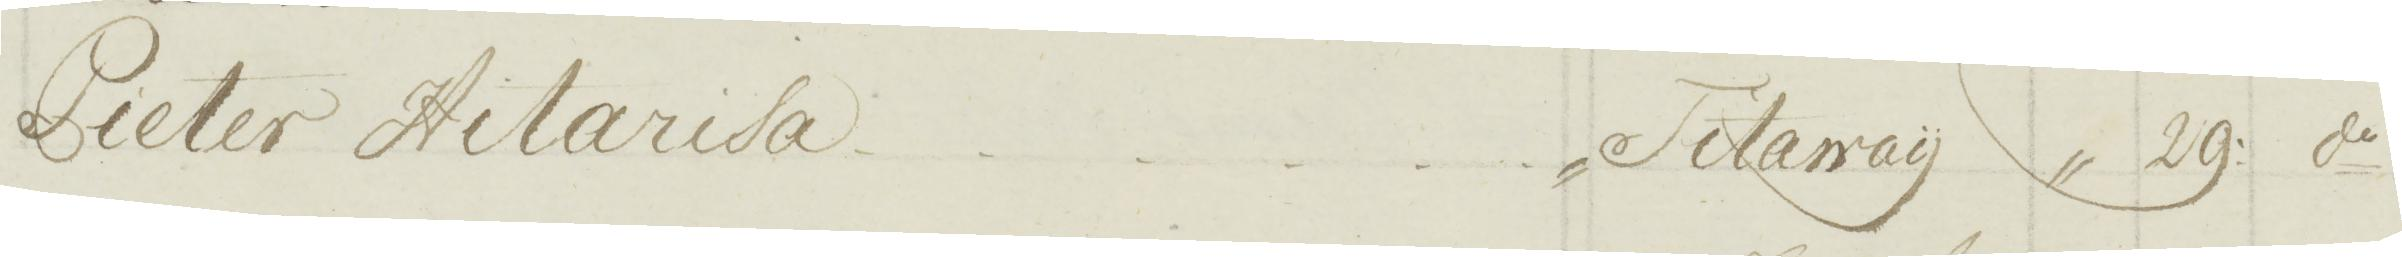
Pieter Hitarisa - - - - - - „ Titawaij „ 29: d=o
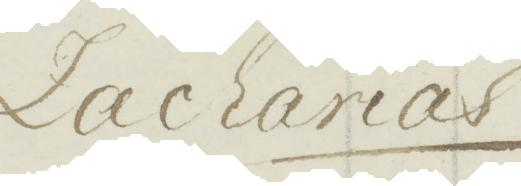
Zacharias
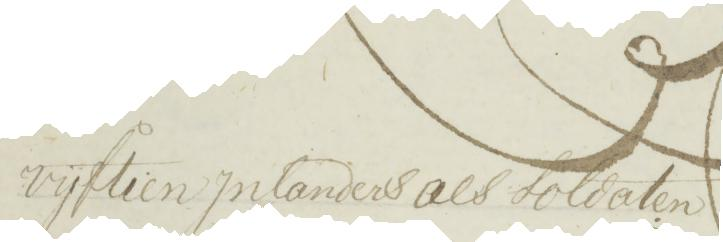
vijftien Inlanders als soldaten
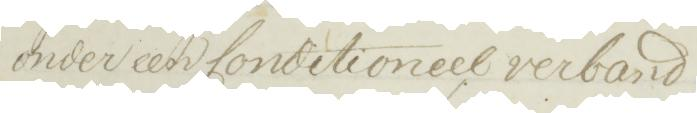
onder een Conditioneel verband
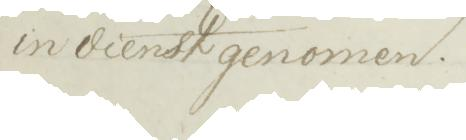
in dienst genomen.
